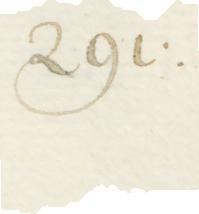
291:
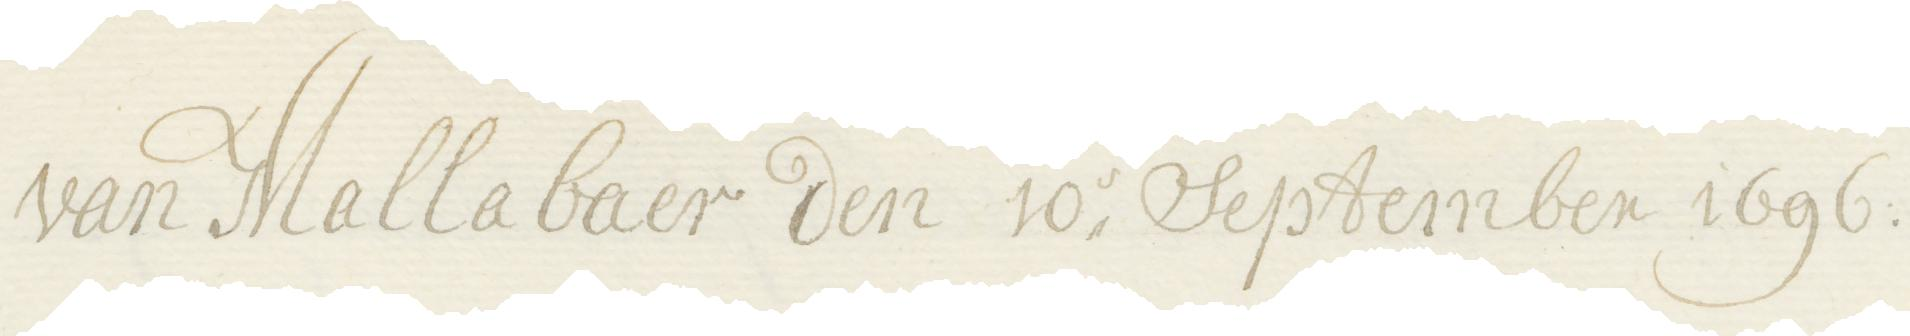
van Mallabaer den 10„e September 1696:
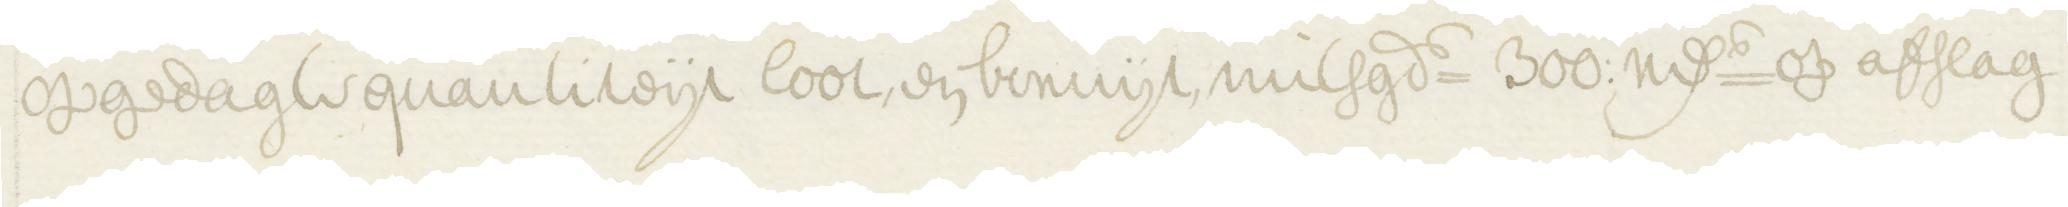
opgedagte quantiteijt loot, en kruijt, mitsgd=s 300: rd=s op afslag
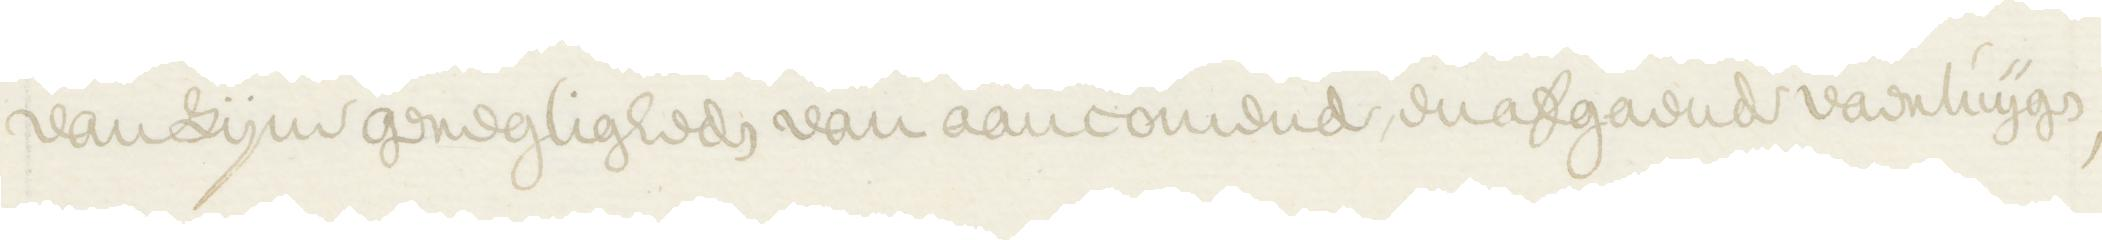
van zijne geregtigheden van aancomende, en afgaende vaertuijgen,
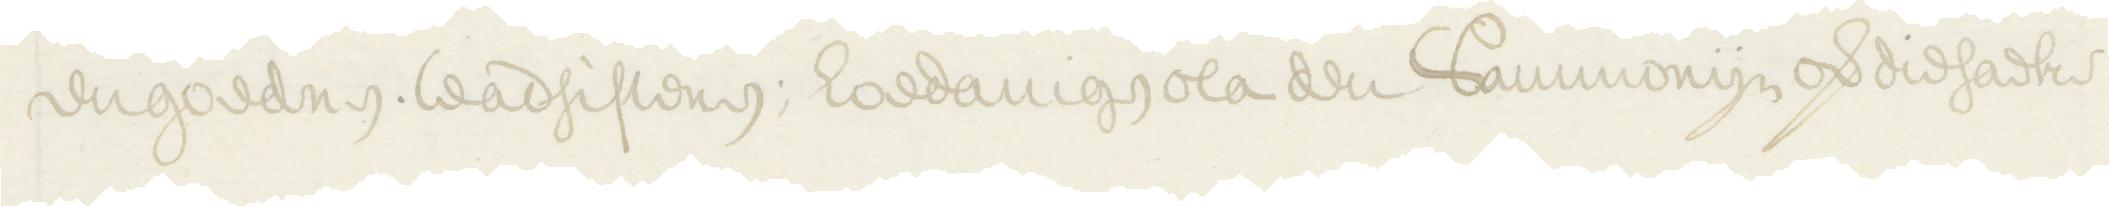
en goederen. te adsisteren; hoedanigen ola den Sammorijn over die saeke
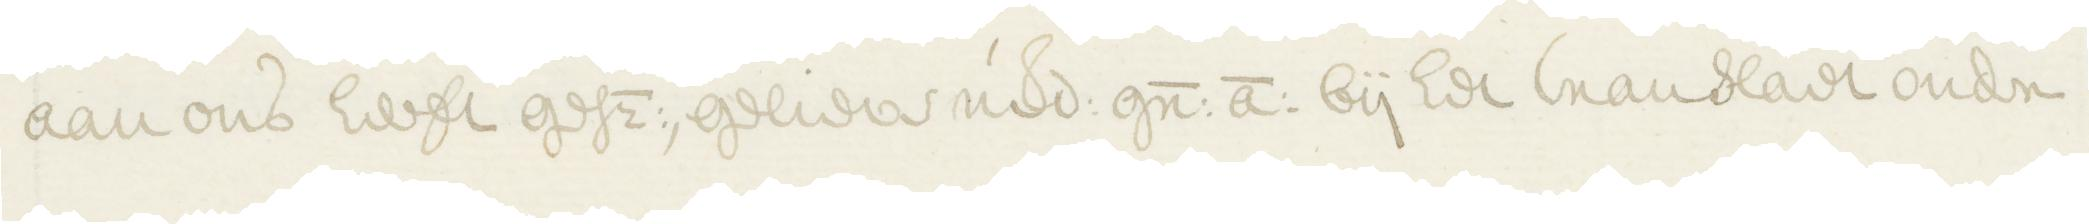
aan ons heeft gesz:, gelieve uEd: gr: a: bij het translaet onder
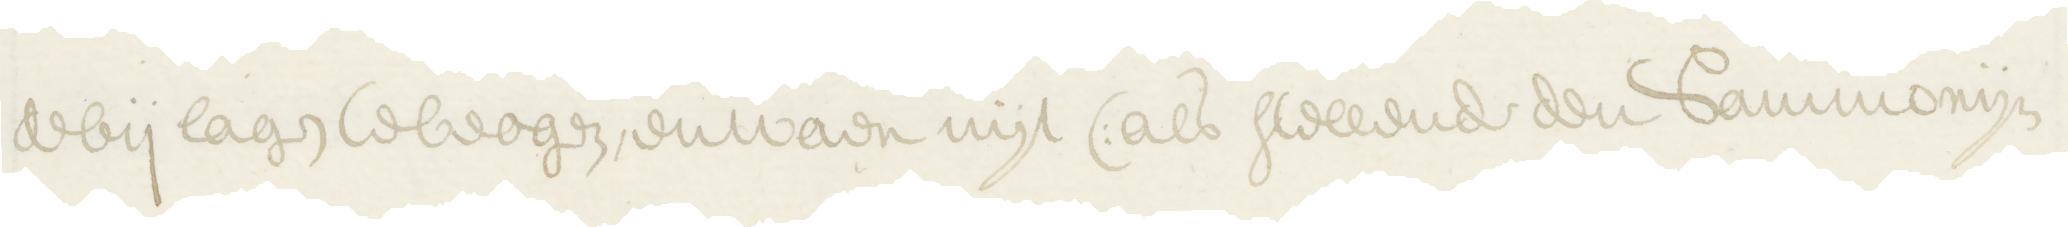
de bij lagen te beogen, en waer uijt (:als stellende den Sammorijn
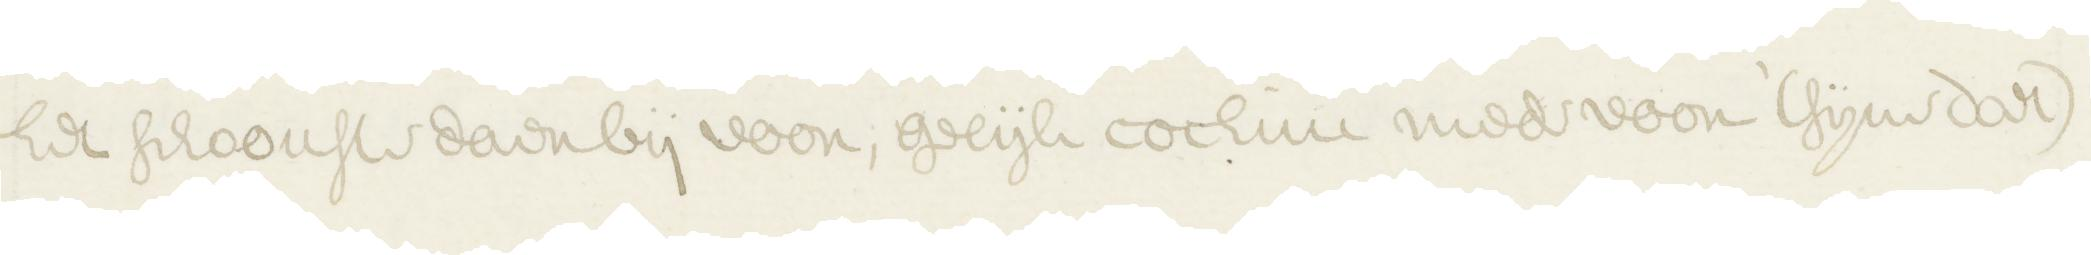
het schoonste daerbij voor; gelijk cochim mede voor ’t sijne doet)
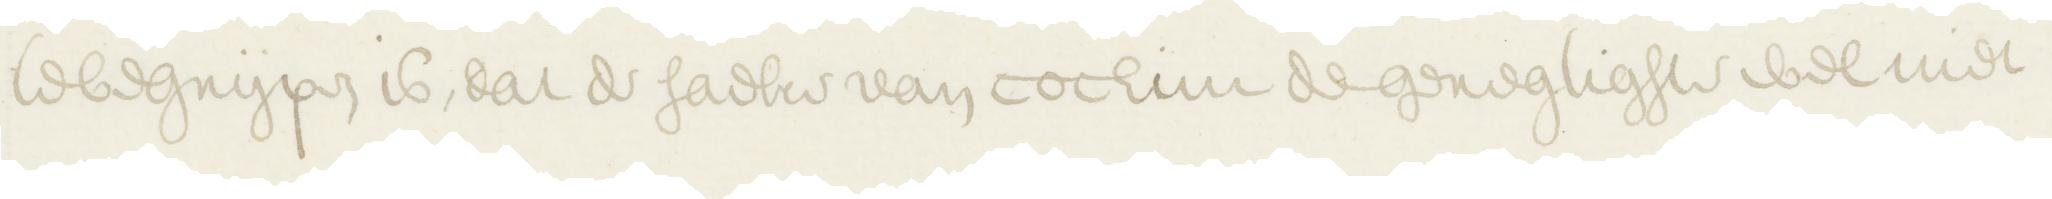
te begrijpen is, dat de saeke van cochim de geregtigste wel niet
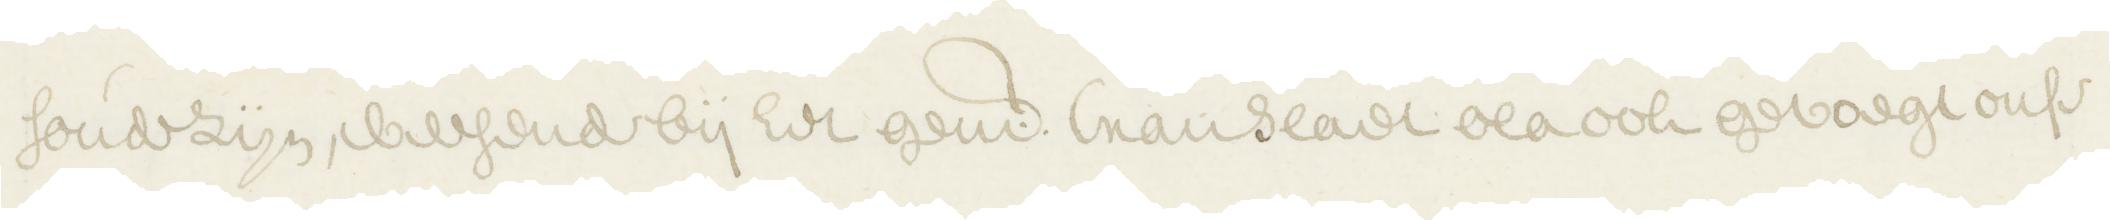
soude zijn, weesende bij het gem: translaet ola ook gevoegt onse
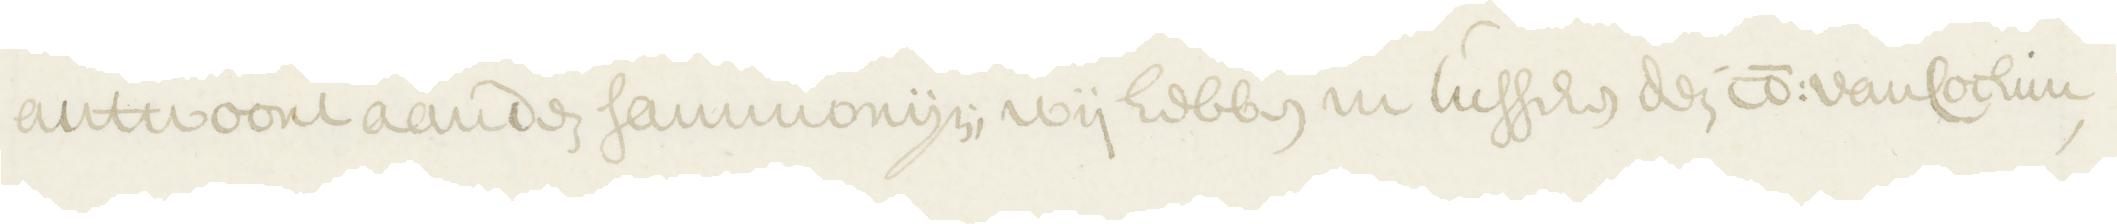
antwoort aan den sammorijn; wij hebben in tusschen den co: van Cochim,
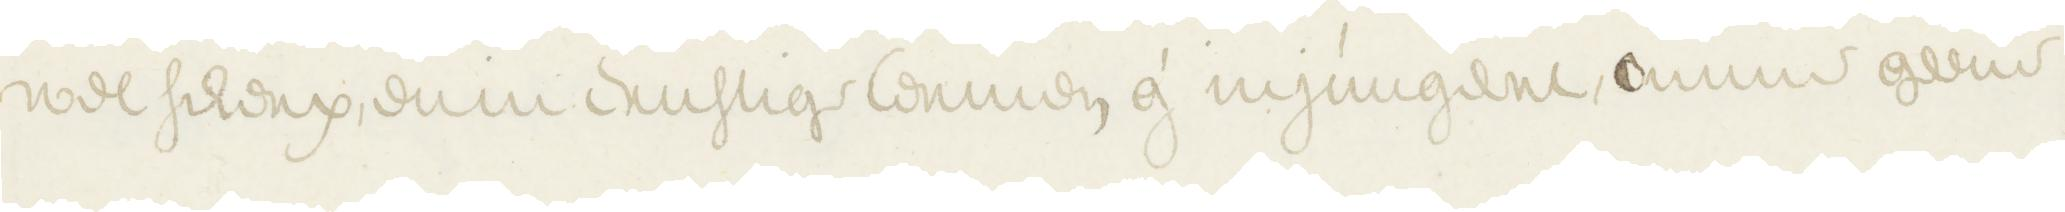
wel scherp, en in ernstig termen g’injungert, omme geene
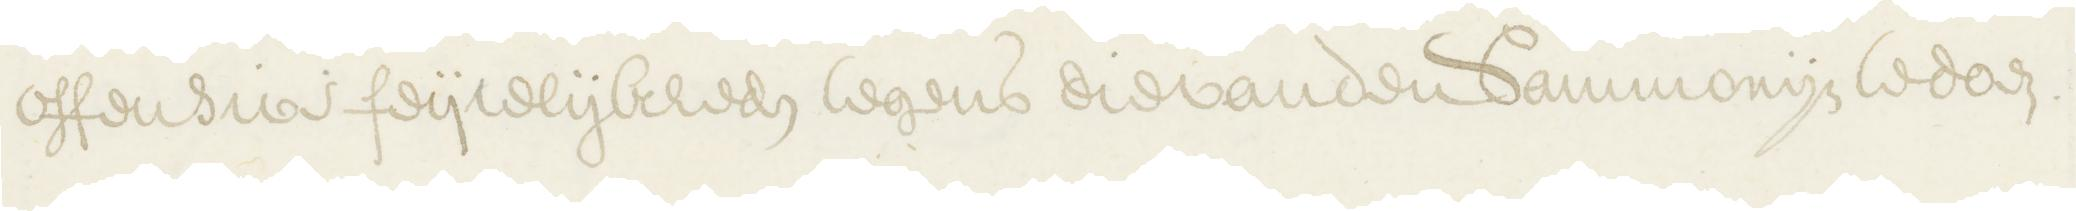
offensive feijtelijkheden tegens die van den Sammorijn te doen
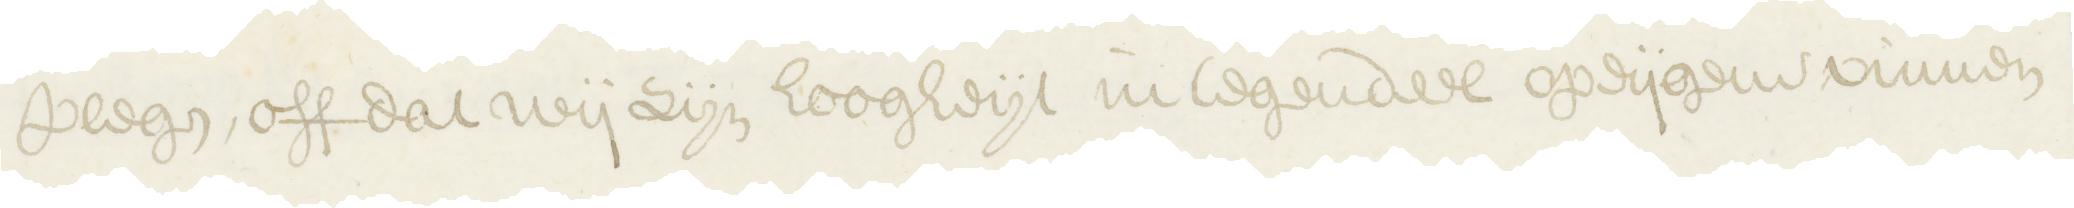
plegen, off dat wij zijn hoogheijt in tegendeel op eijgene vinnen
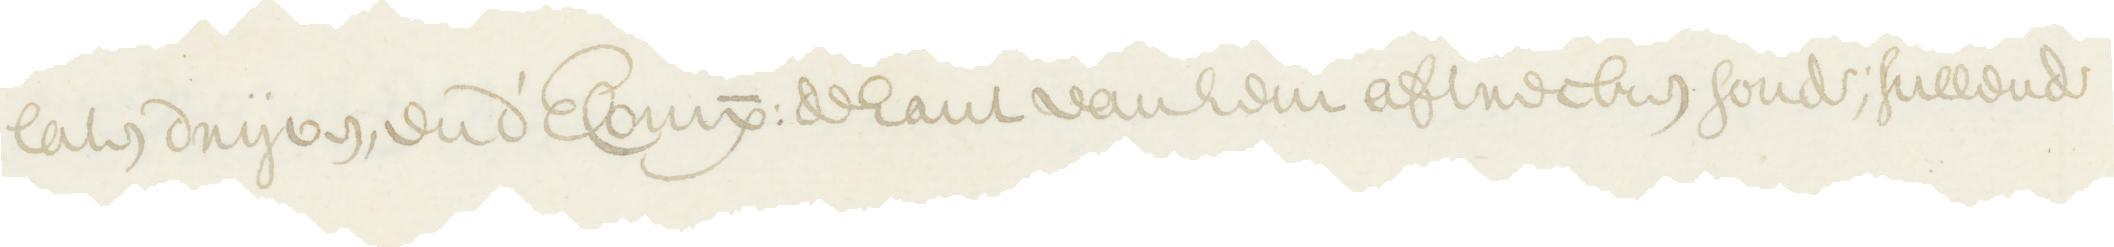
laten drijven, en d’EComp: de hant van hem aftrecken soude, sullende
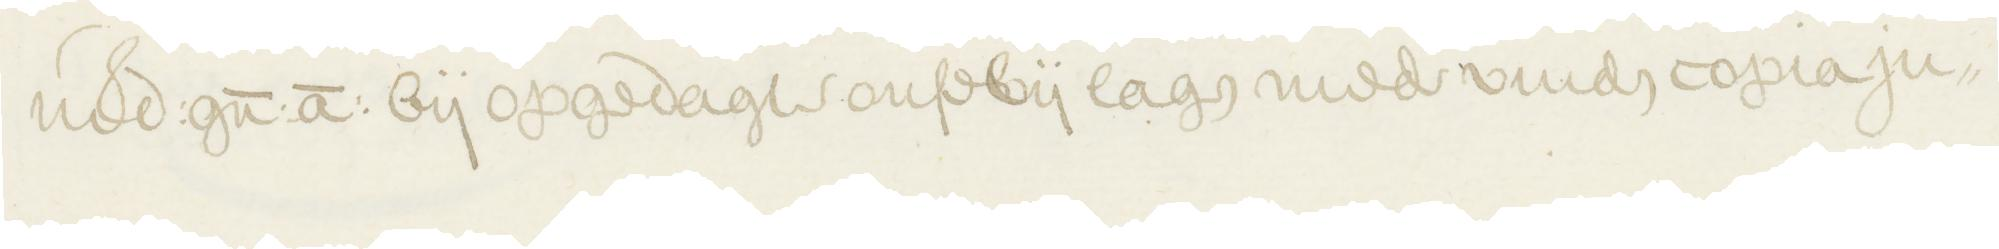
uEd: gr: a: bij opgedagte onse bij lagen mede vinden copia jn„
